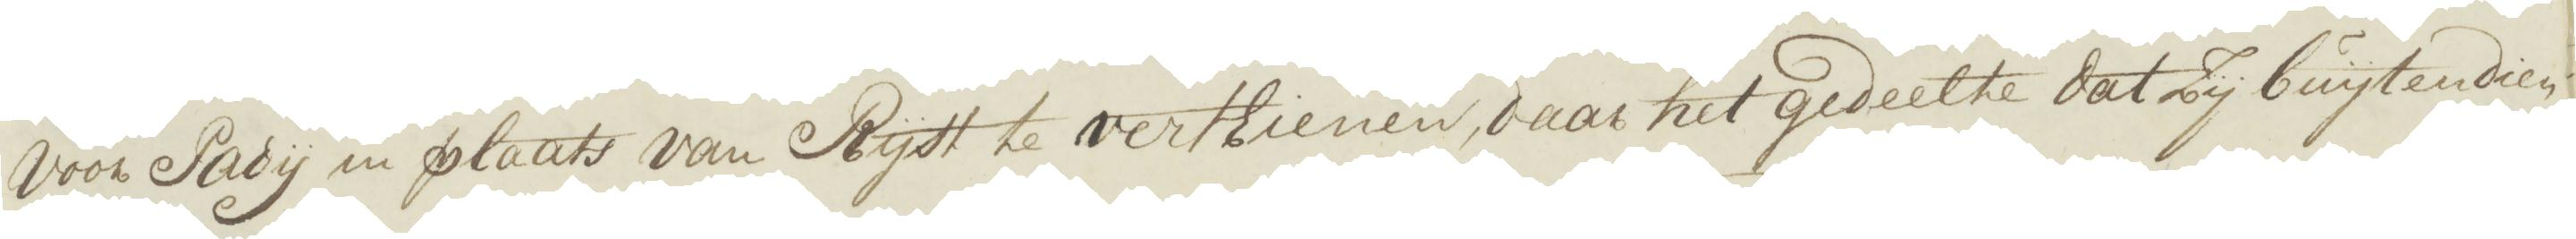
voor Padij in plaats van Rijst te verthienen, daar het gedeelte dat zij buijtendien
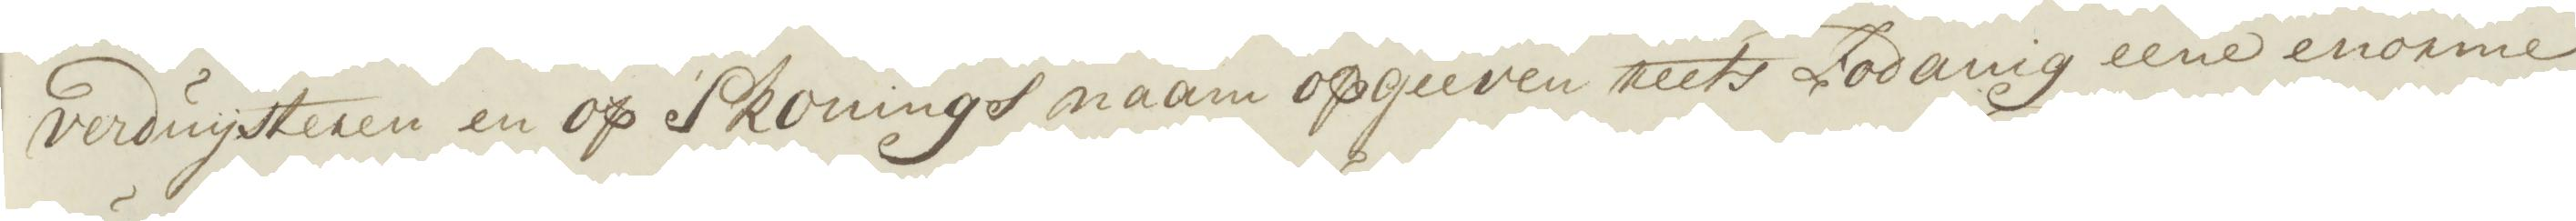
verduijsteren en op ’skonings naam opgeeven reets zodanig eene enorme
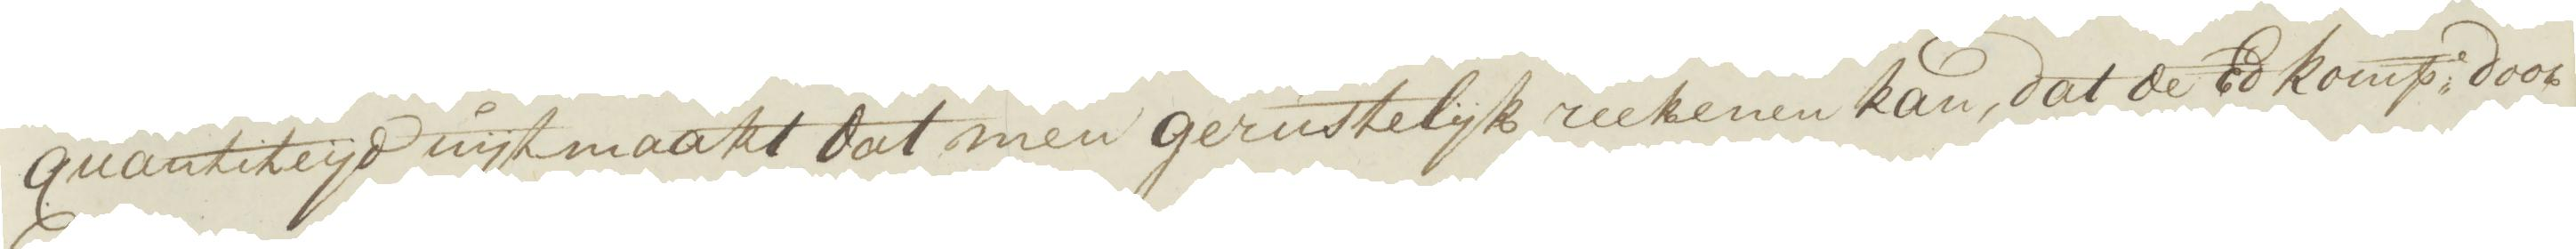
quantiteijd uijtmaakt dat men gerustelijk reekenen kan, dat de Ed komp„e door
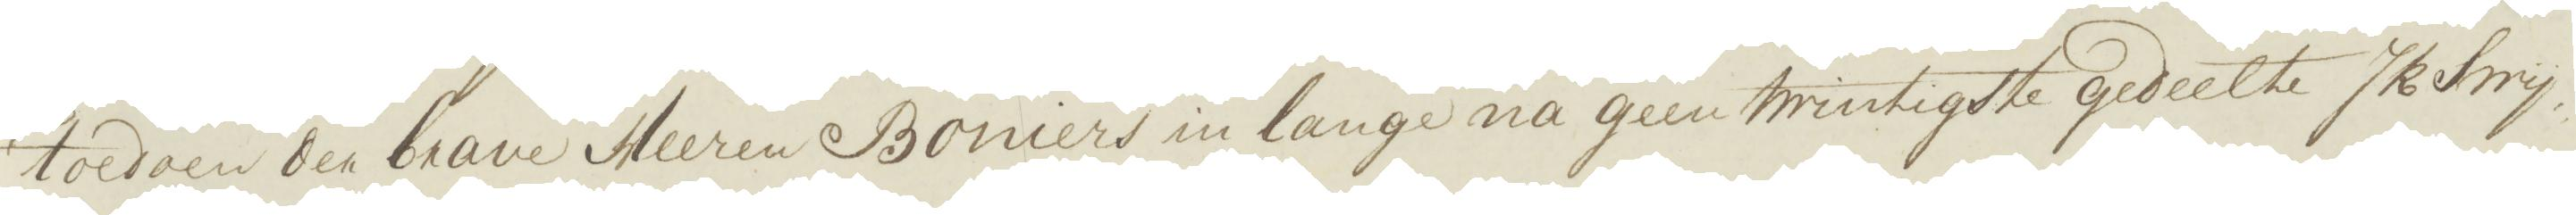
toedoen der brave Heeren Boniers in lange na geen twintigste gedeelte Jk swij„
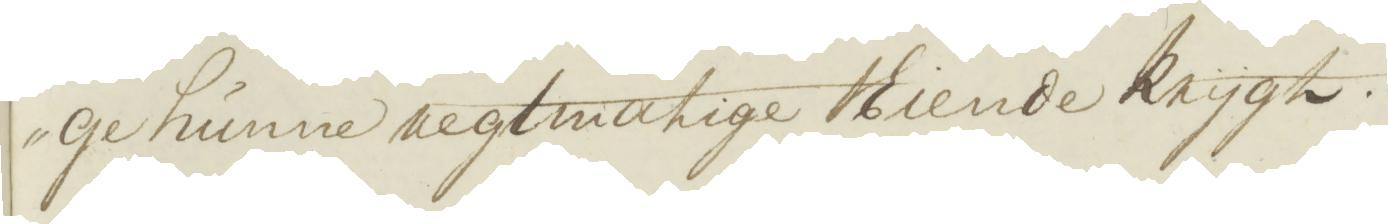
„ge hunne regtmatige thiende krijgt.
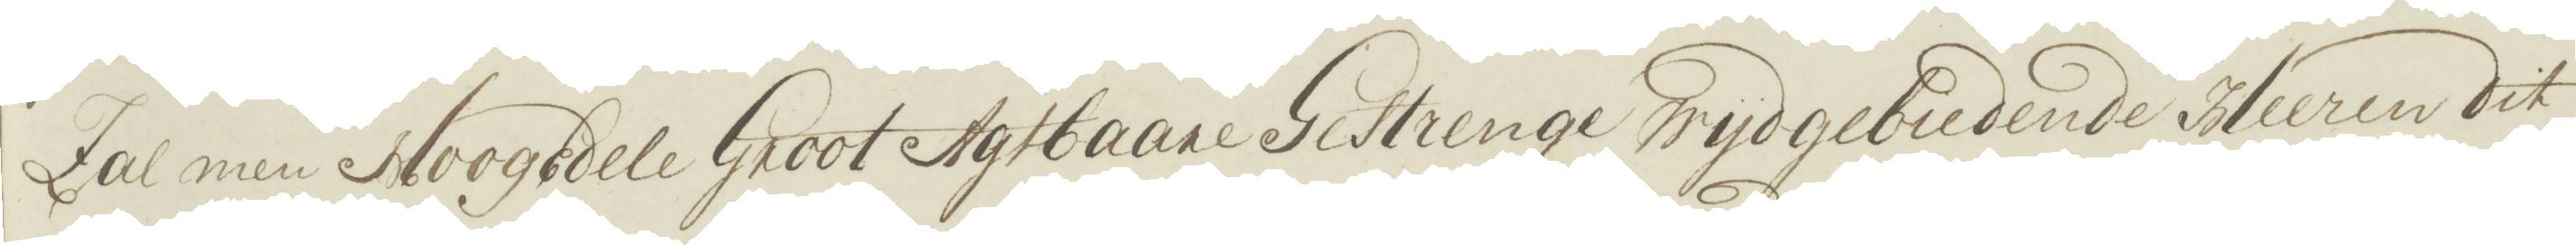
Zal men HoogEdele Groot Agtbaare Gestrenge wijdgebiedende Heeren dit
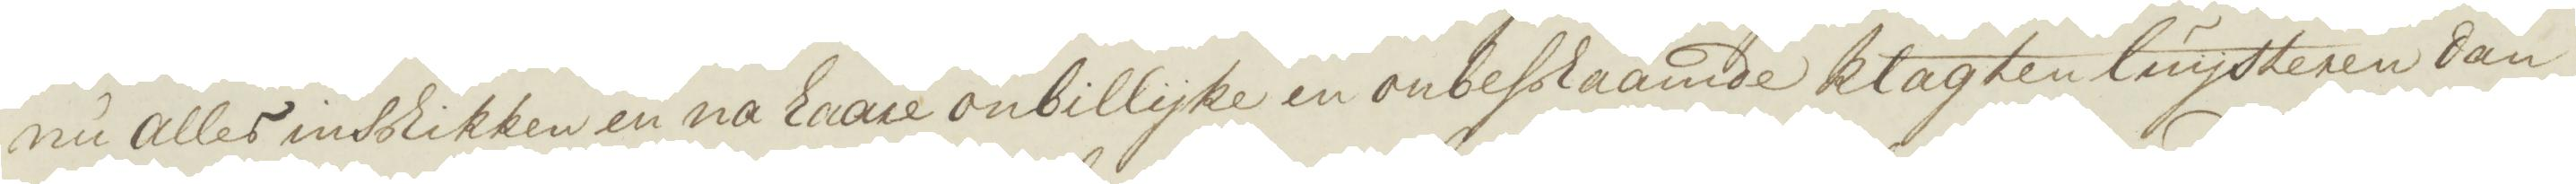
nu alles inschikken en na haare onbillijke en onbeschaamde klagten luijsteren dan
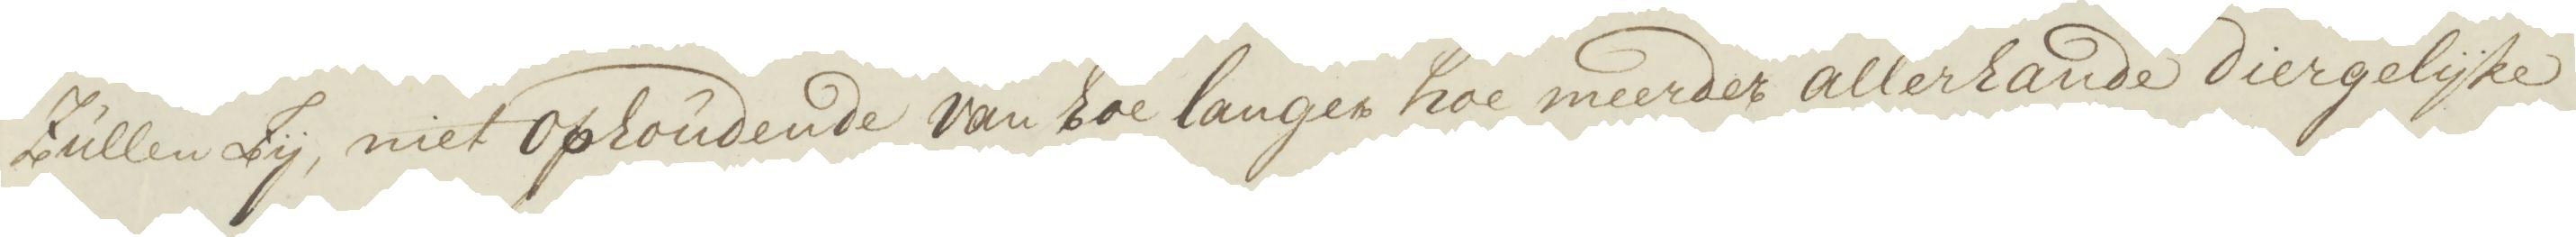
zullen zij, niet ophoudende van hoe langer hoe meerder allerhande diergelijke
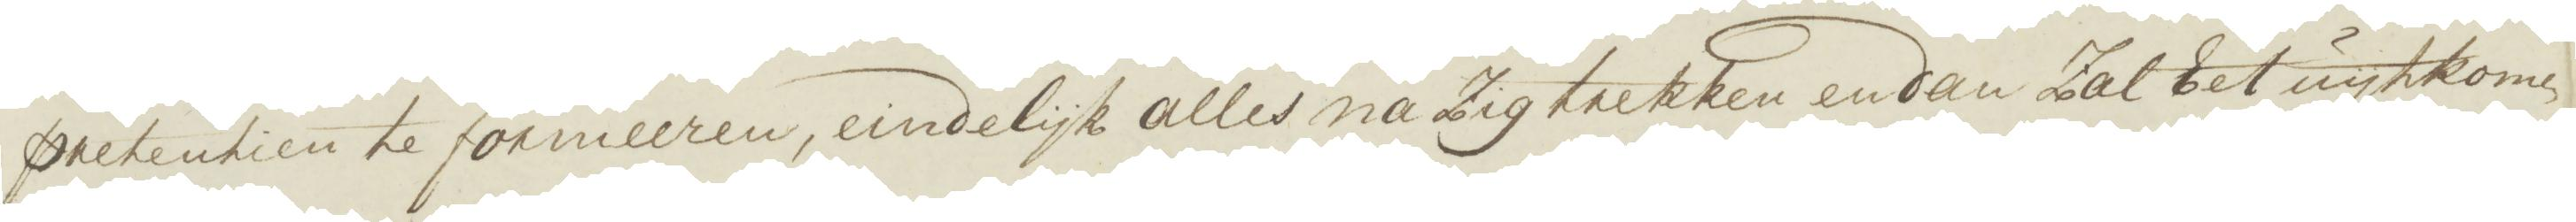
pretentien te formeeren, eindelijk alles na zig trekken en dan zal het uijtkomen
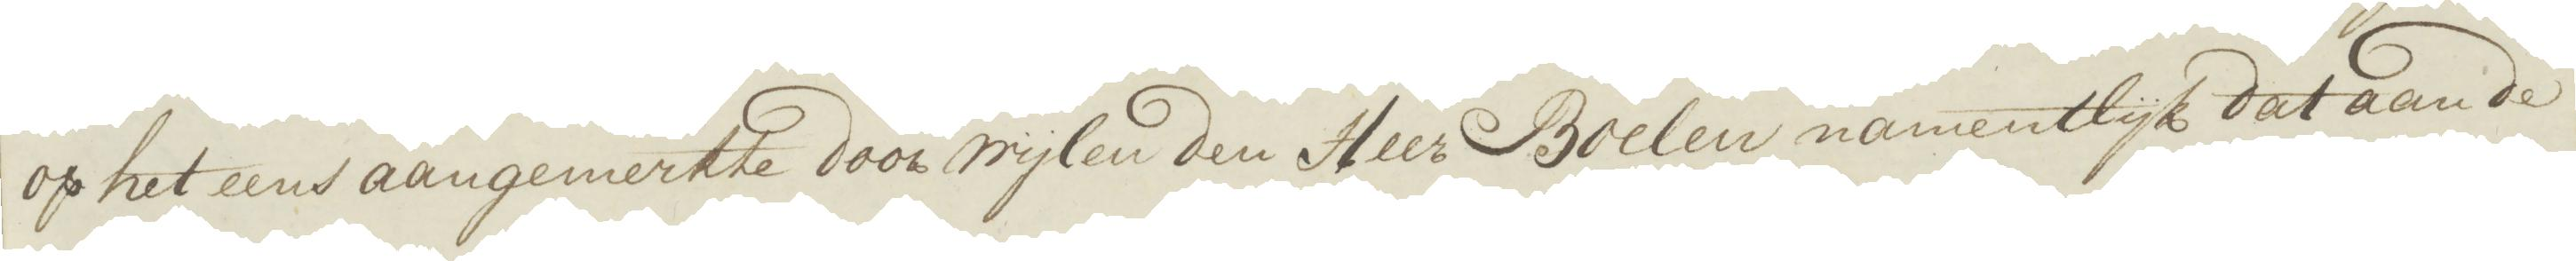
op het eens aangemerkte door wijlen den Heer Boelen namentlijk dat aan de
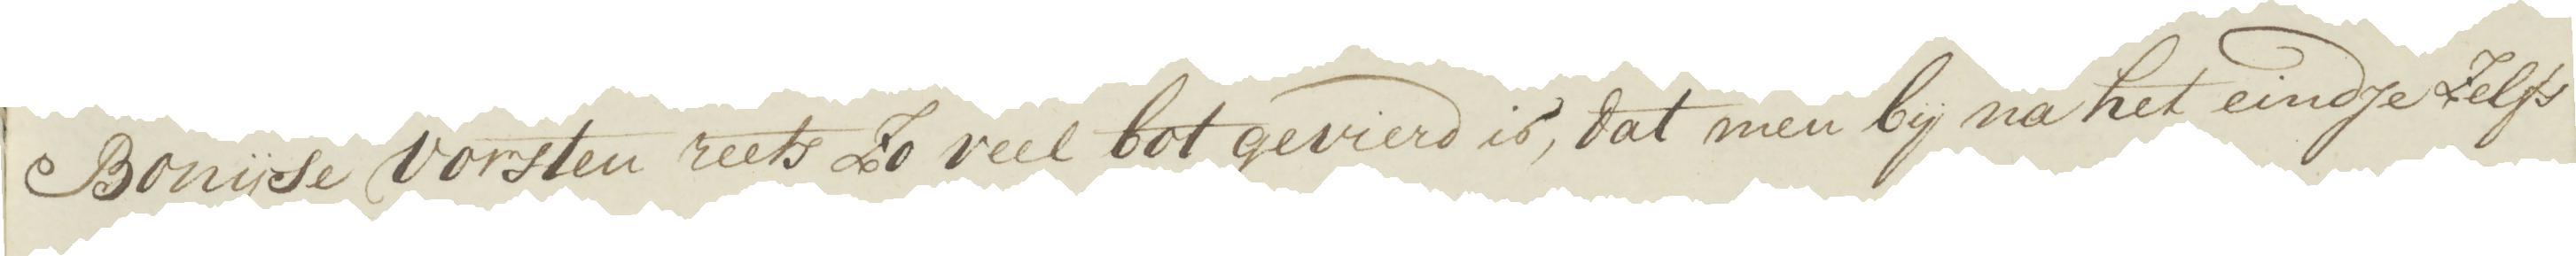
Bonijse vorsten reets zo veel bot gevierd is, dat men bij na het eindje zelfs
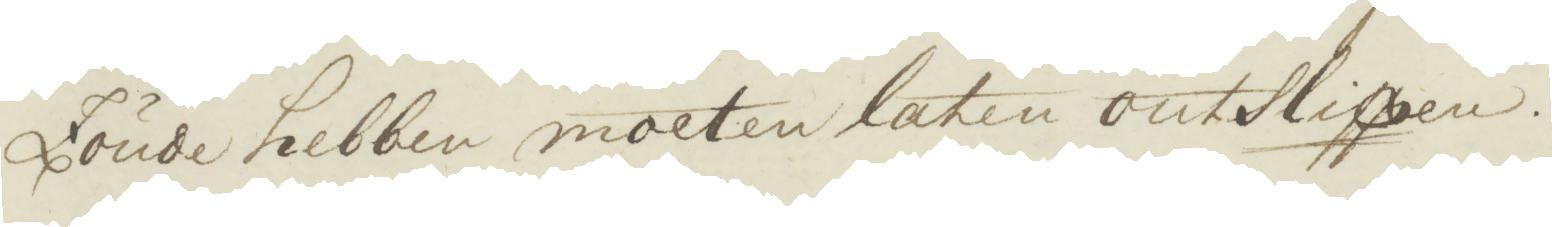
zoude hebben moeten laten ontslippen
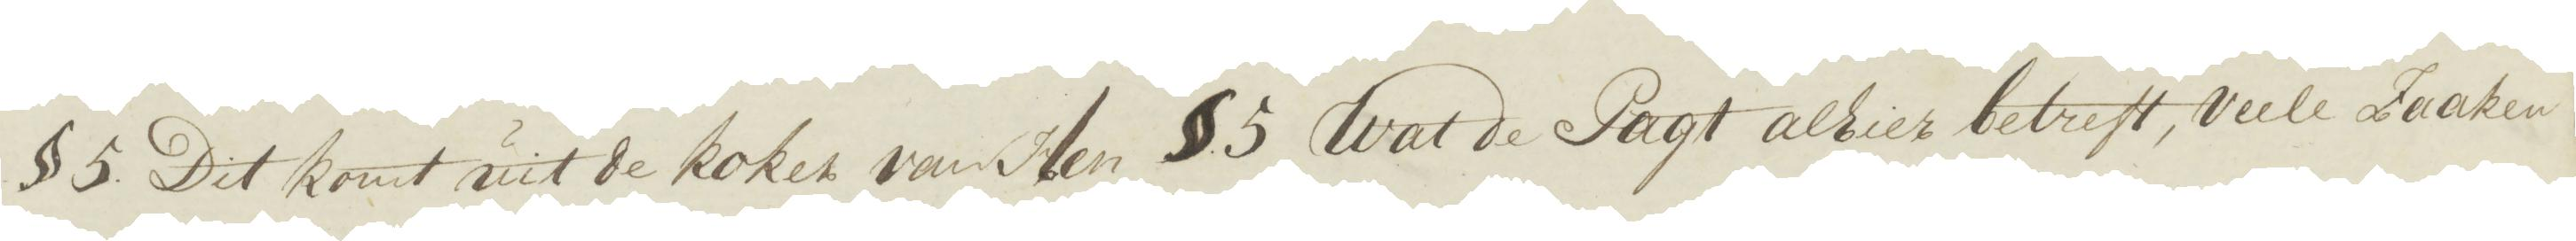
§5. Dit komt uit de koker van Hen„ §5 wat de Pagt alhier betreft, veele zaaken
